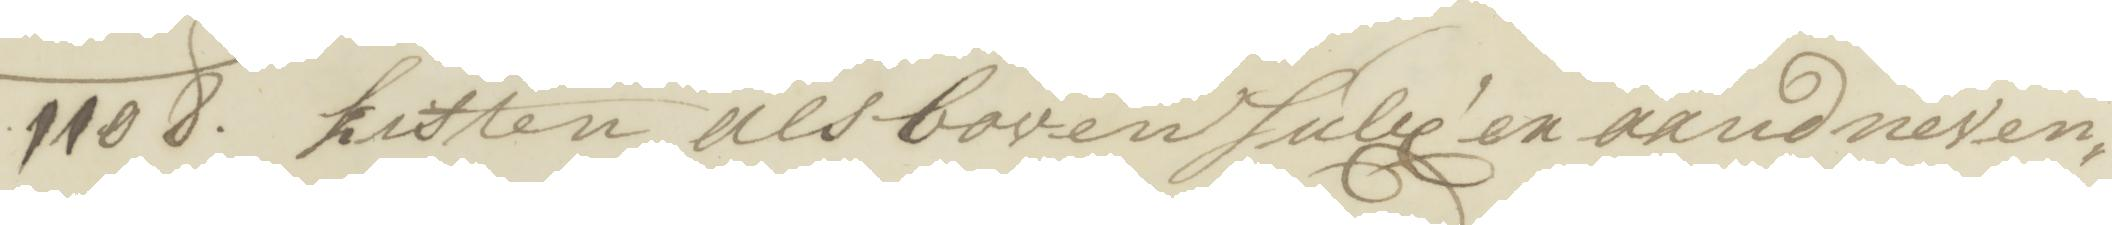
1108. kisten als boven sulx 'er aand neven„
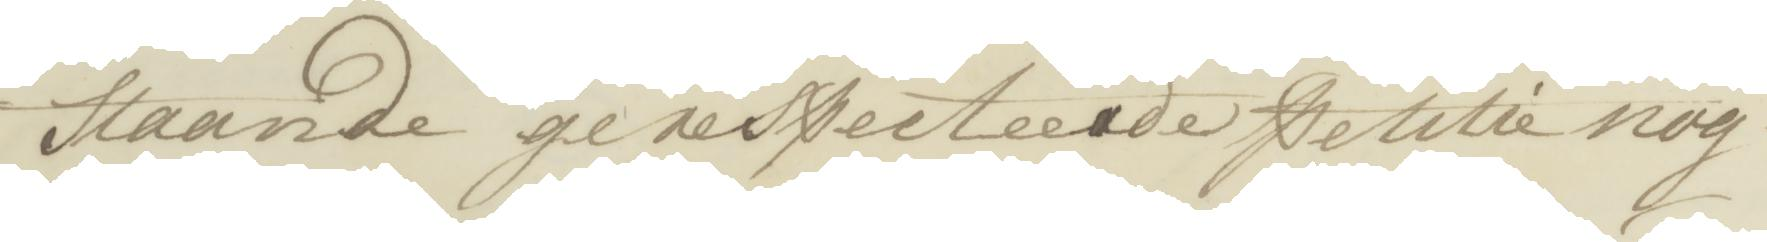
staande gerespecteerde petitie nog —
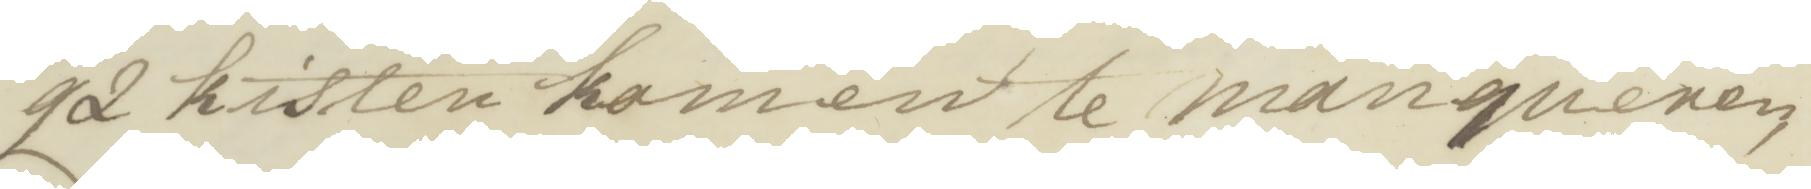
92 kisten komen te manqueren
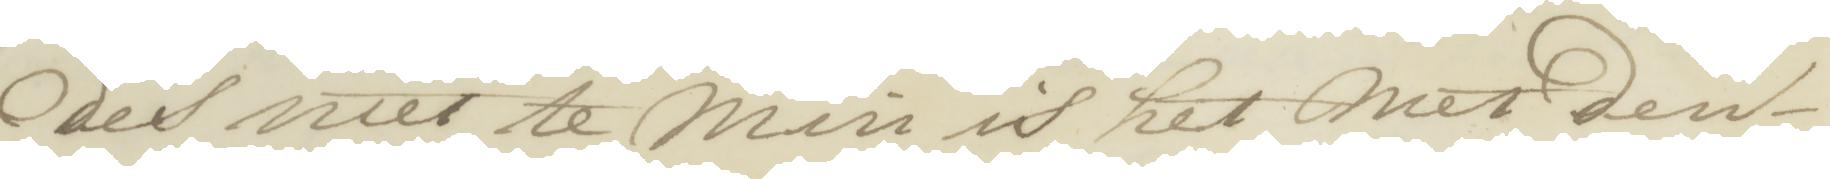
des niet te min is het met den —
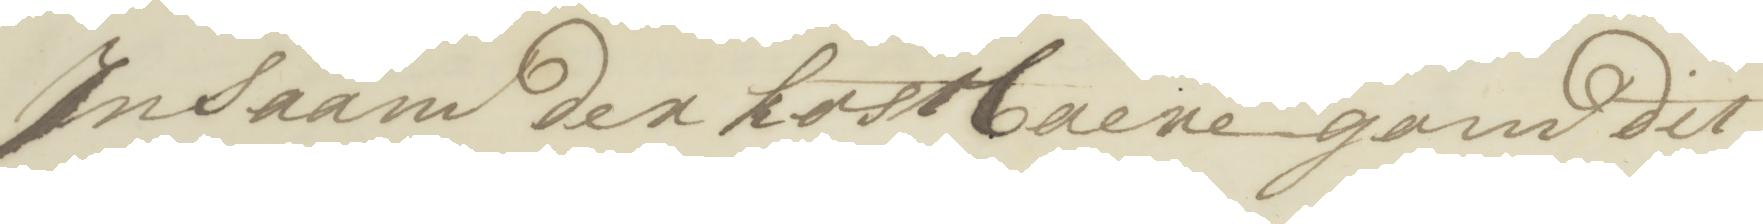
Jnsaam der kostbaere gom dit
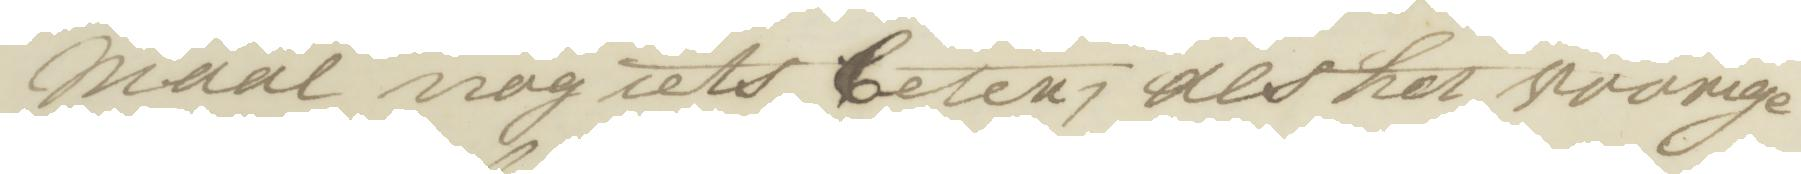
maal nog iets beter, als het voorige
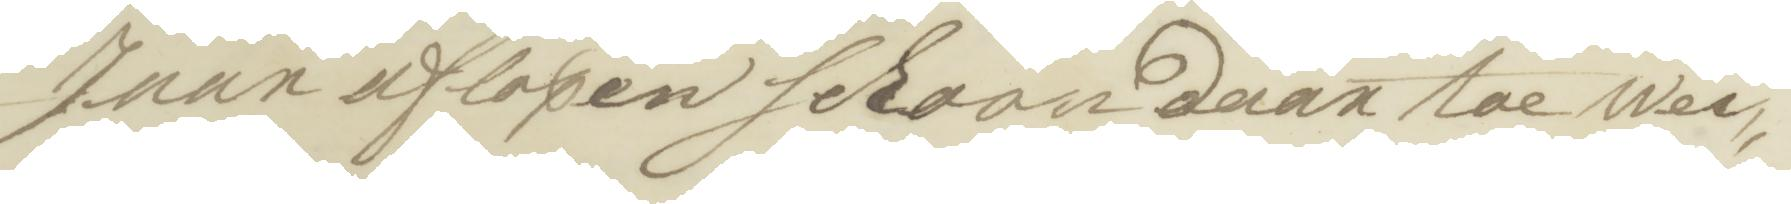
Jaar aflopen schoon daar toe wei„
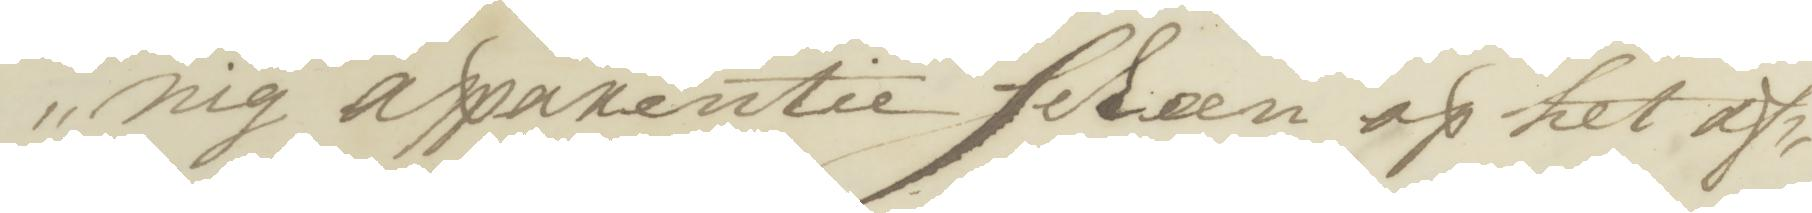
„nig apparentie scheen op het af„
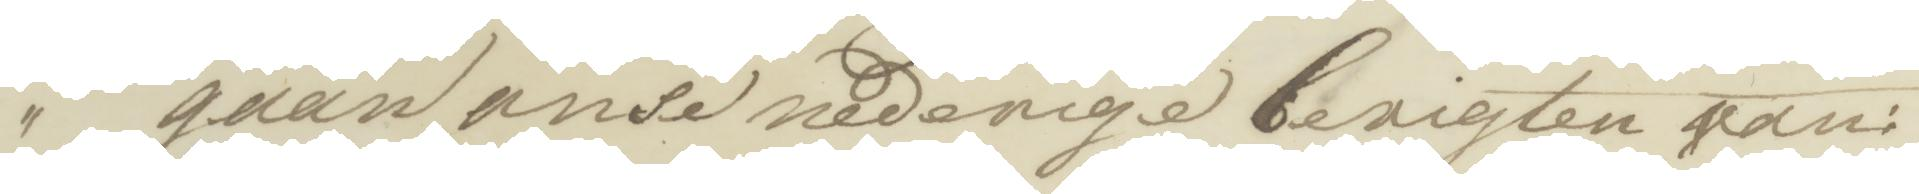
„gaan onse nederige berigten van:
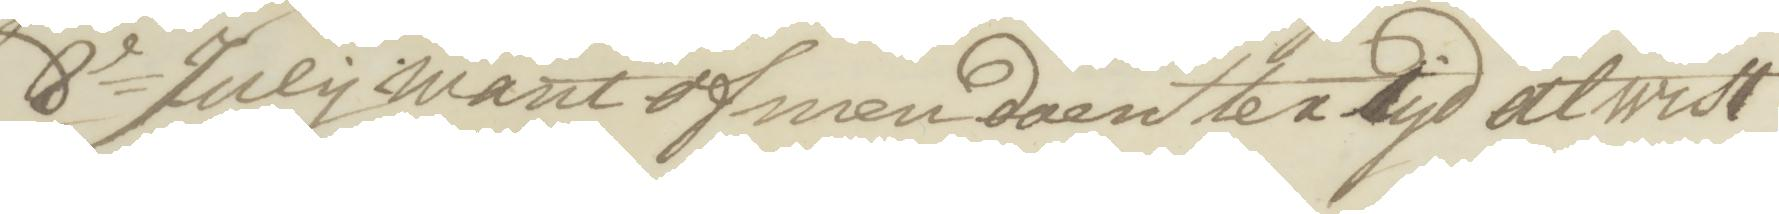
8=' Julij want of men doen ter tijd al wist
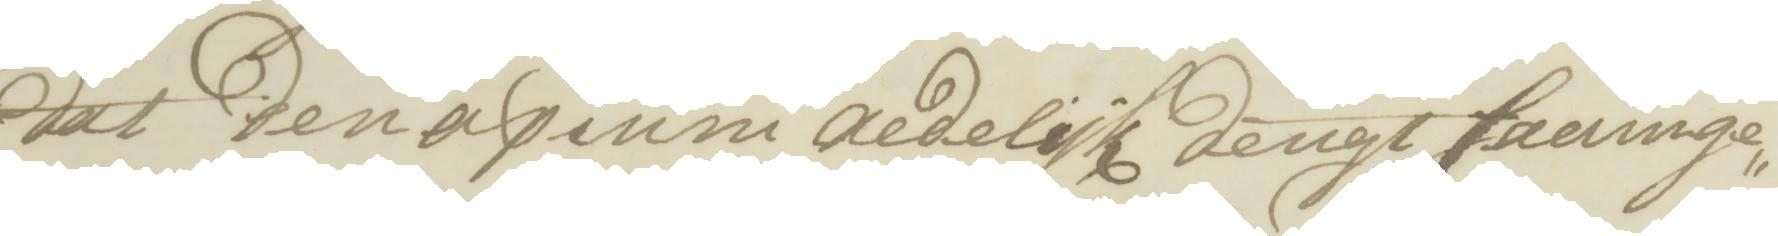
dat den opium redelijk deugtsaamge„
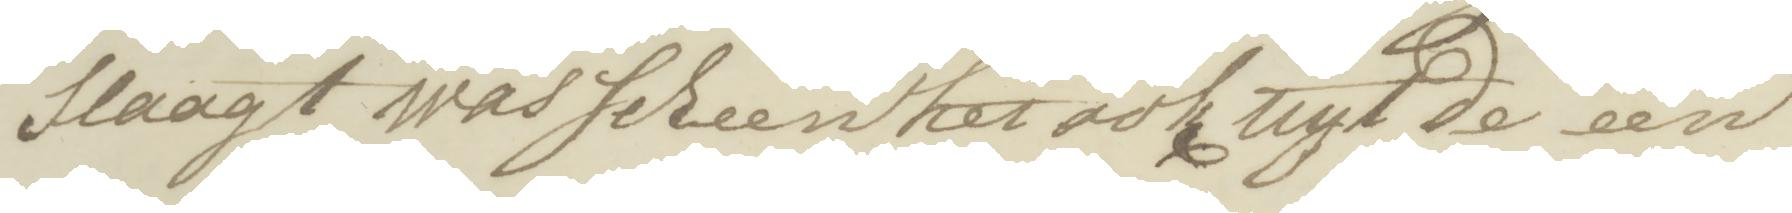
slaagt was scheen het ook uijt de een
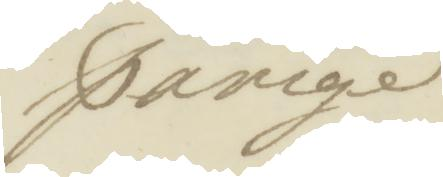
parige
